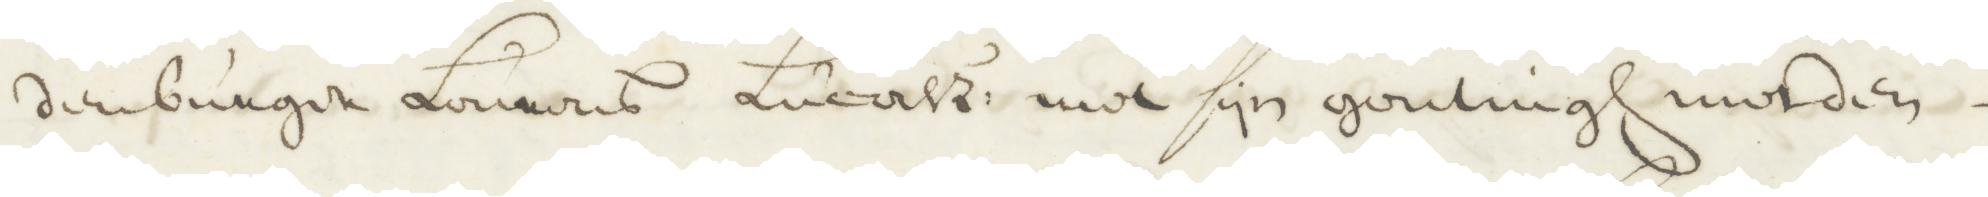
den burger Lourens Lucasz: met sijn gontingh met den
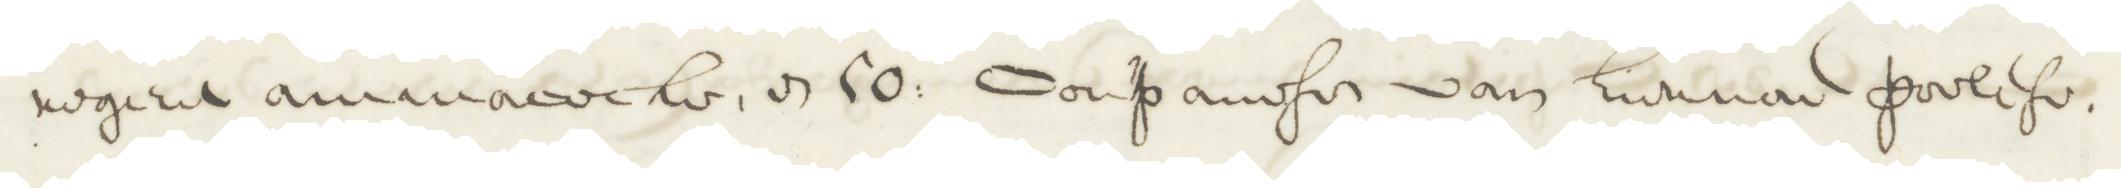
regent ammacocke, en 50: Coupanesen van hiernae poelese
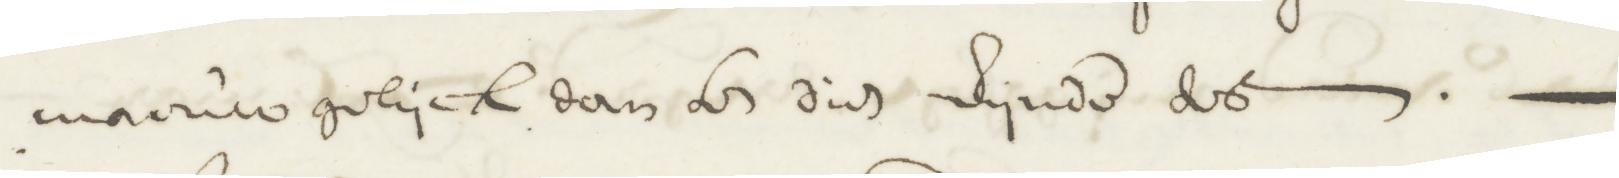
naeuw gelijck dan ten dien Eijnde des. —
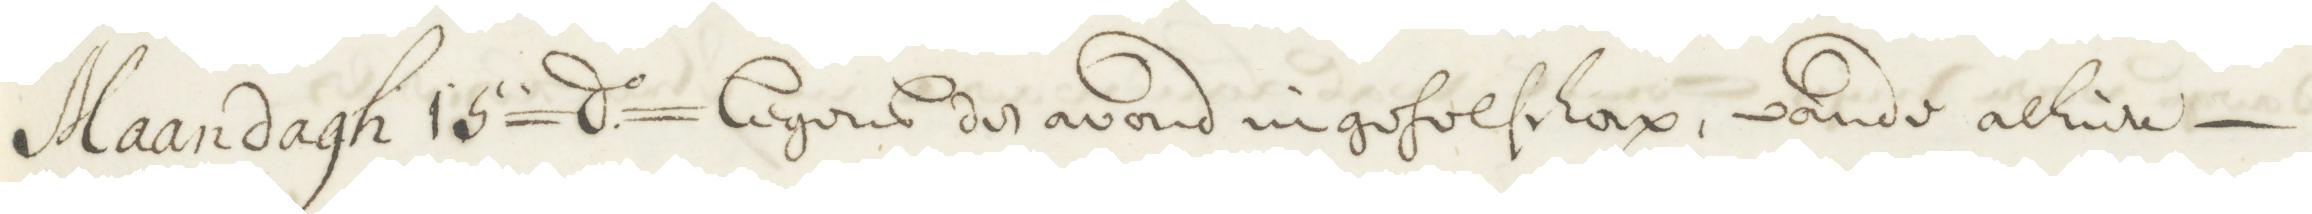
Maandagh 15=e d=o Tegens den avond in geselschap, vande alhier —
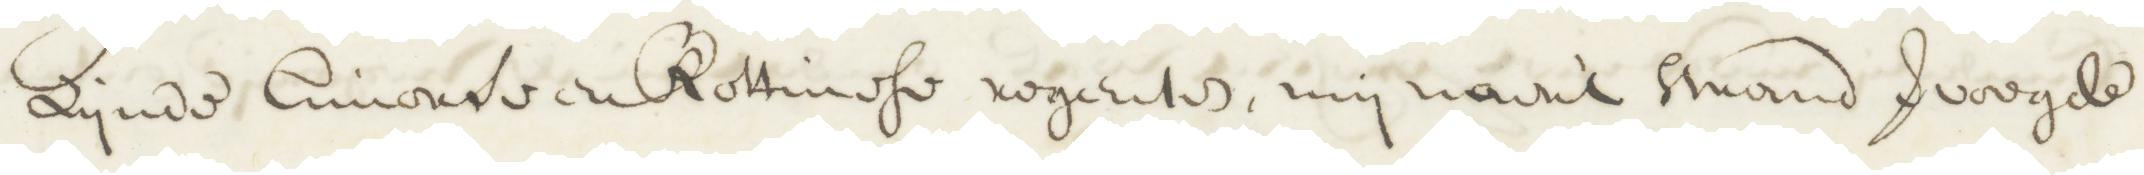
zijnde Timorse en Rottinese regenten, mij naer’t strand vervoegde
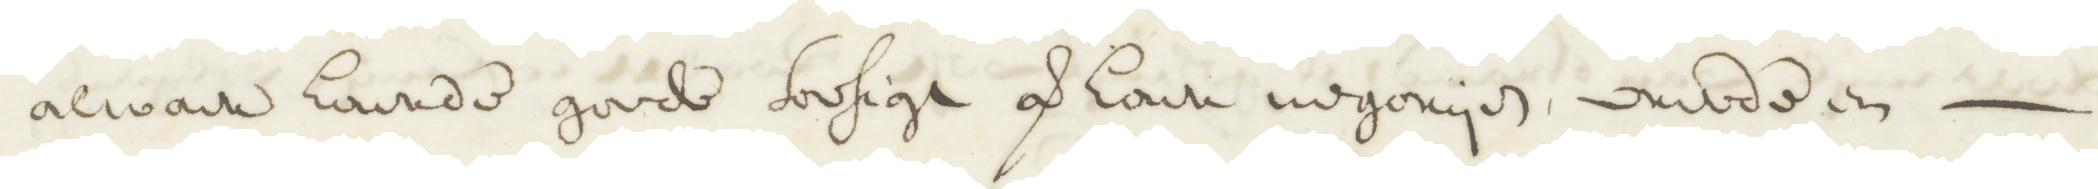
alwaer haerde goede toesigt over haer negorijen, vreede en —
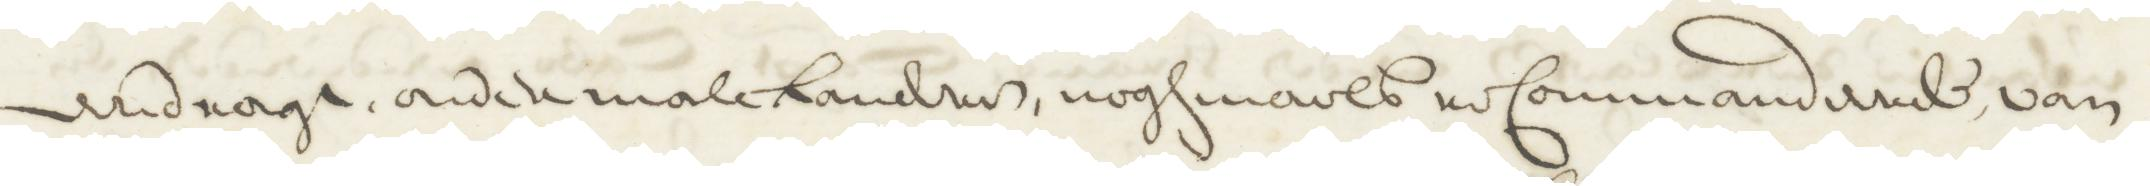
eendragt, onder malckanderen, noghmaels recommandeerde, van
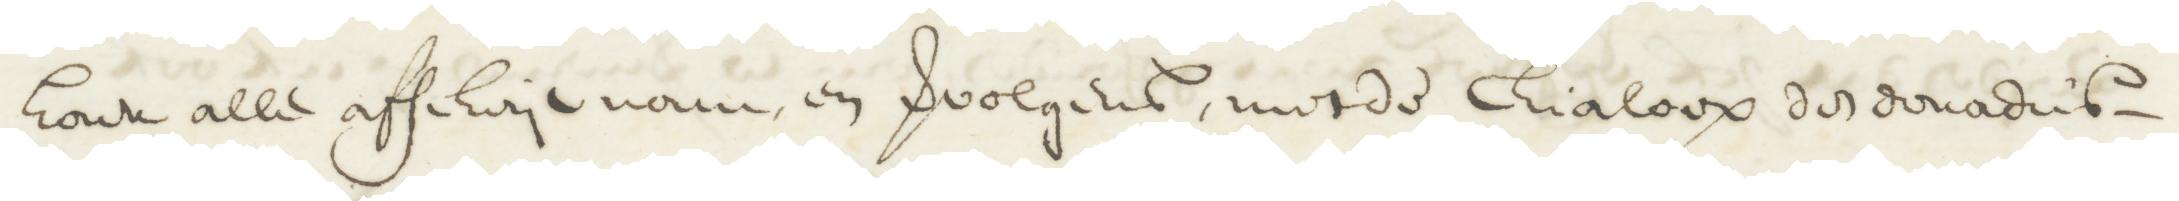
haer alle afscheijt nam, en vervolgens, met de Chialoep den doradus-
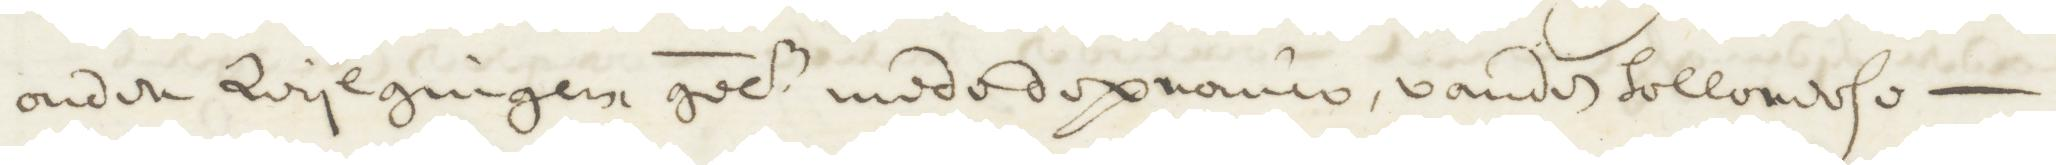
onder zeijl gingen, gelijk mede deprauw, vanden solloreese —
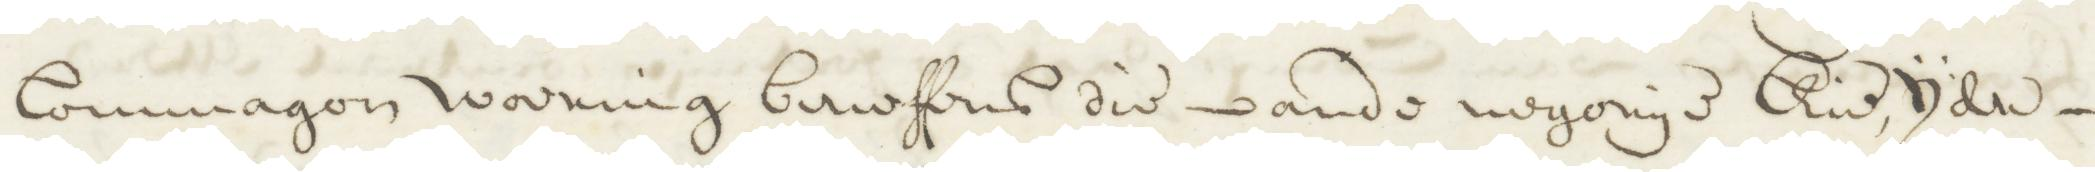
Commagon woering beneffens die van de negorije Chie, IJder -
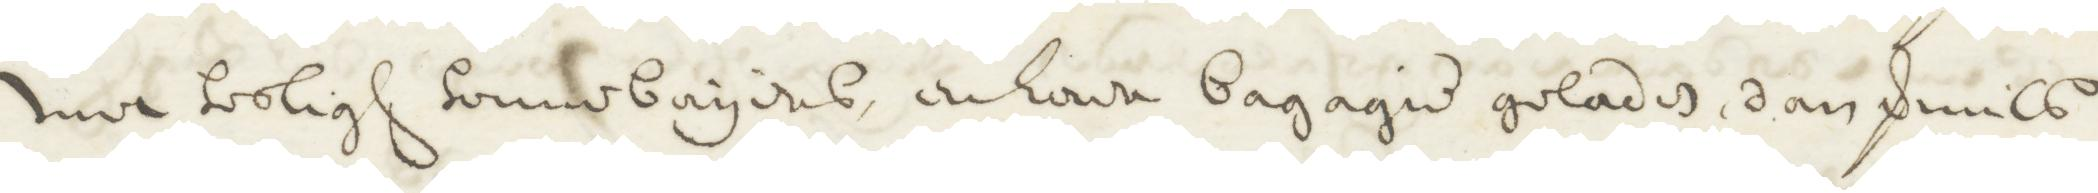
met sestigh sonnebaijers, en haere bagagie geladen, dan vermits
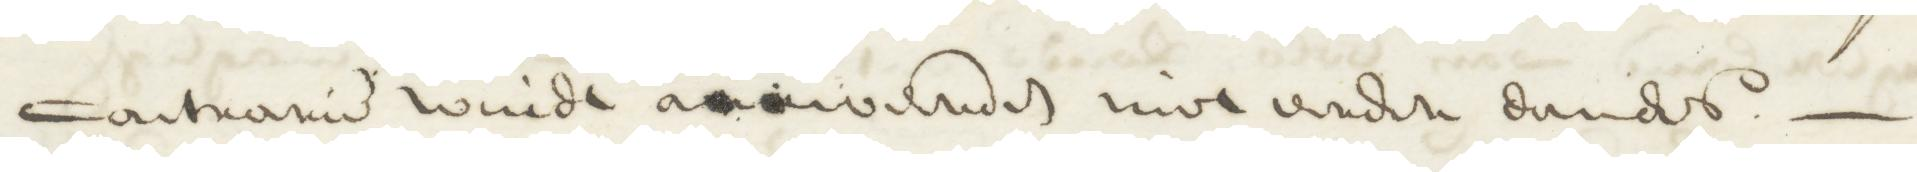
contrarie windt arriveerden niet eerder dandes. —
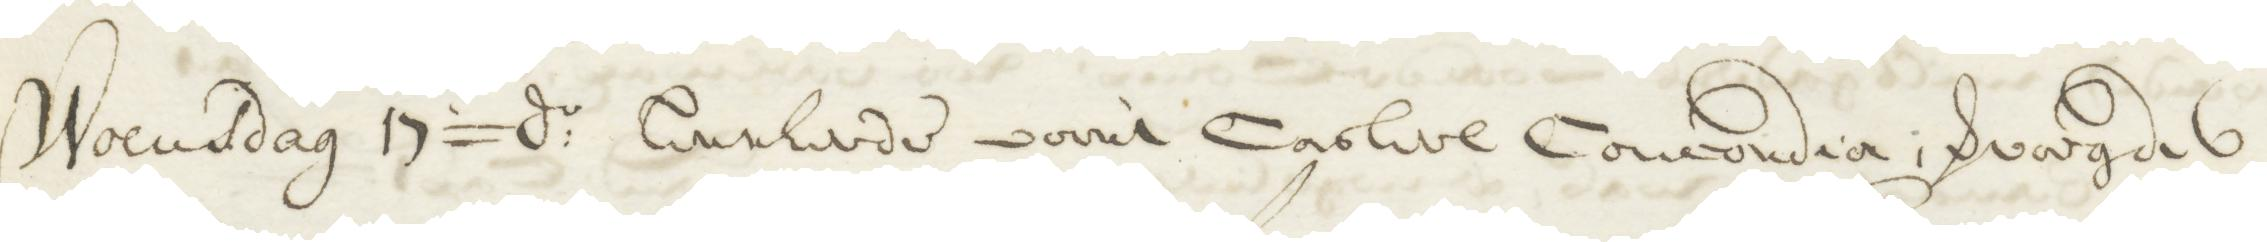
Woensdag 17=d:o Terrheede voor't Casteel Concordia; vervoegde,
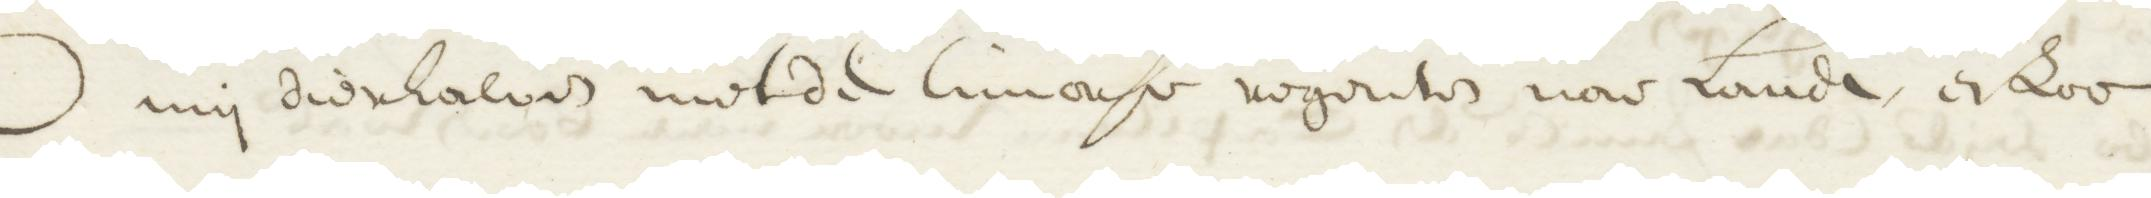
mij dierhalven metde timorse regenten nae Landt, en zoo
